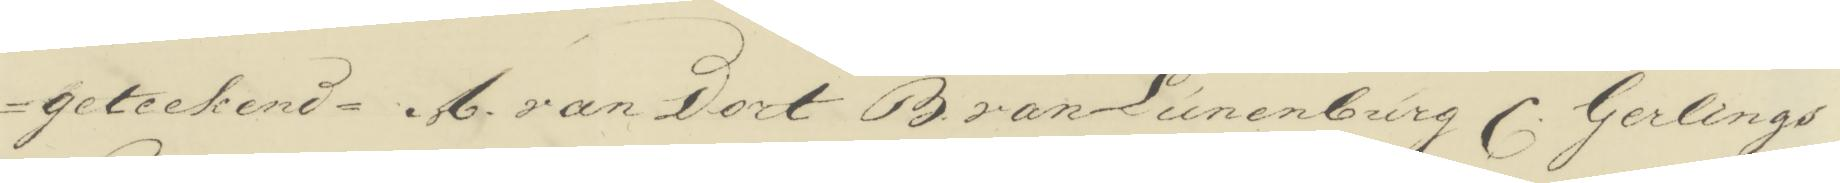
= geteekend = A. van Dort B. van Lunenburg C. Gerlings
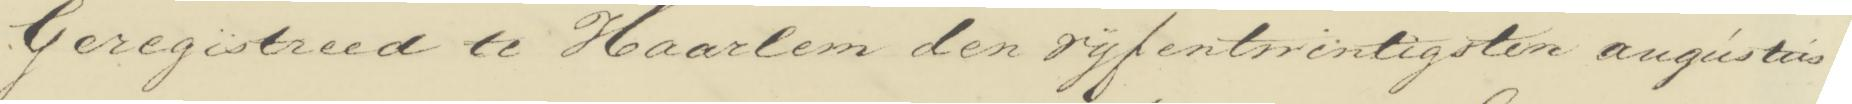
Geregistreed te Haarlem den vijfentwintigsten augustus
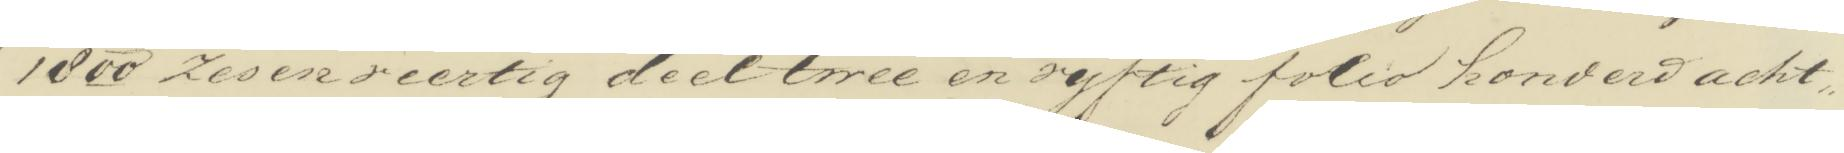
1800 zes en veertig deel twee en vyftig folio honderd acht„
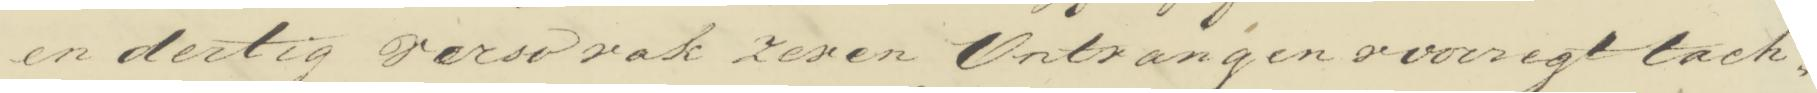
en dertig verso vak zeven Ontvangen voorregt tach„
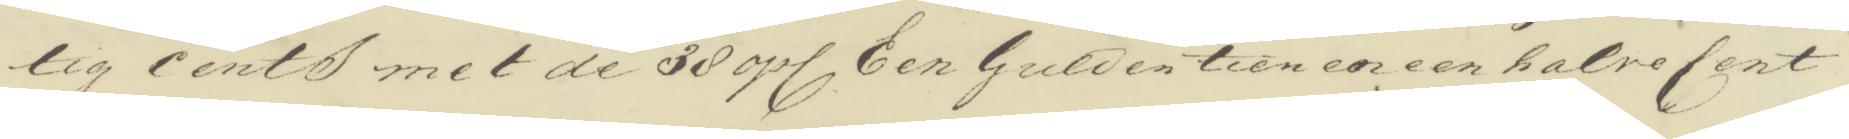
tig cents met de 38 opC Een Gulden tien en een halve Cent
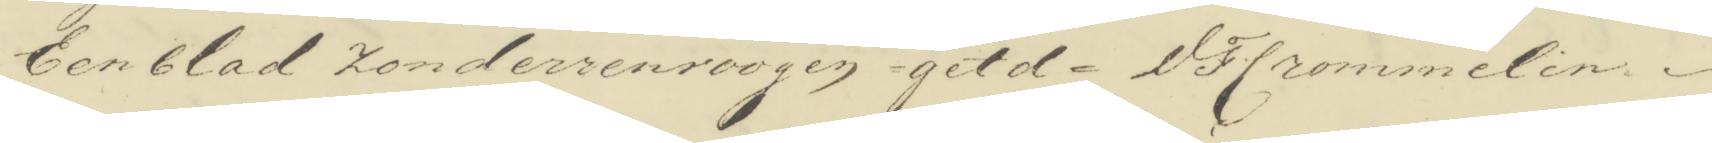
Een blad zonderrenvooyen = getd = DF Crommelin. —
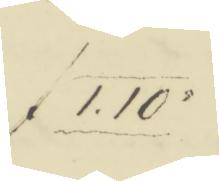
ƒ 1. 10
